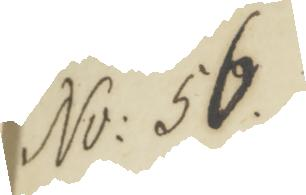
No: 56.
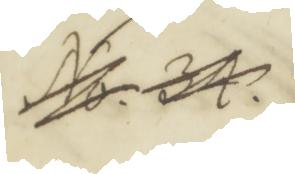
No: 34.
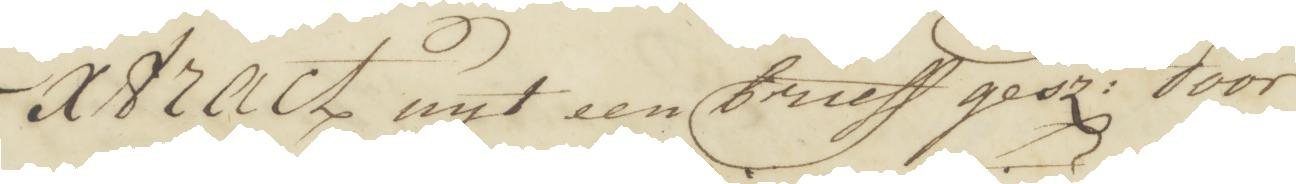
xtract uyt een brieff gesz: door
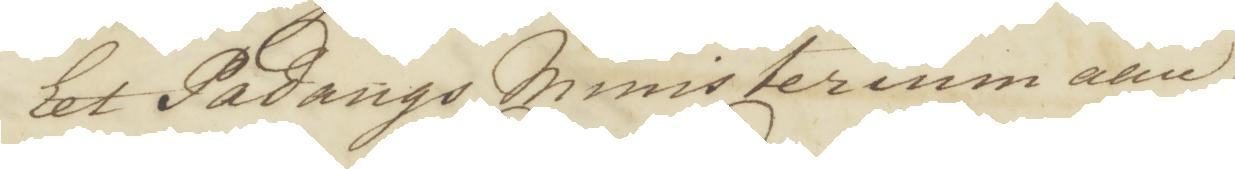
het Padangs Ministerium aan
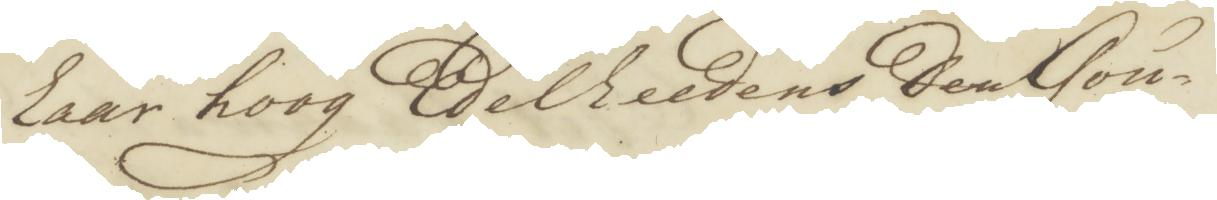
haar hoog Edelheedens den Gou„
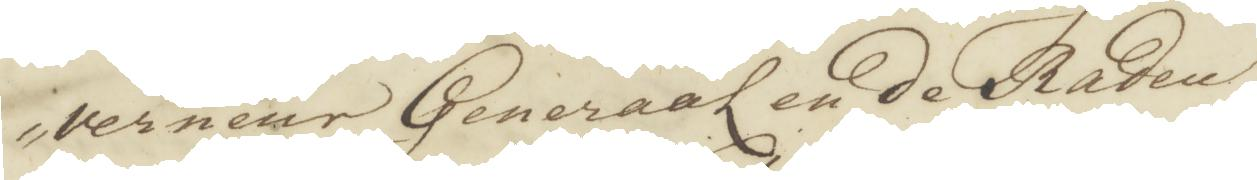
„verneur Generaal en de Raden
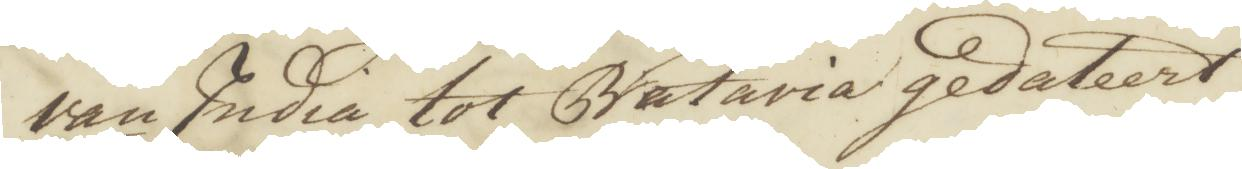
van India tot Batavia gedateert
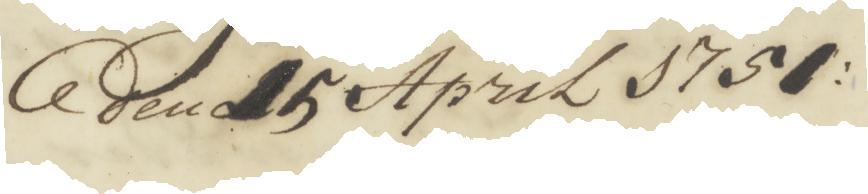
den 15 April 1751:
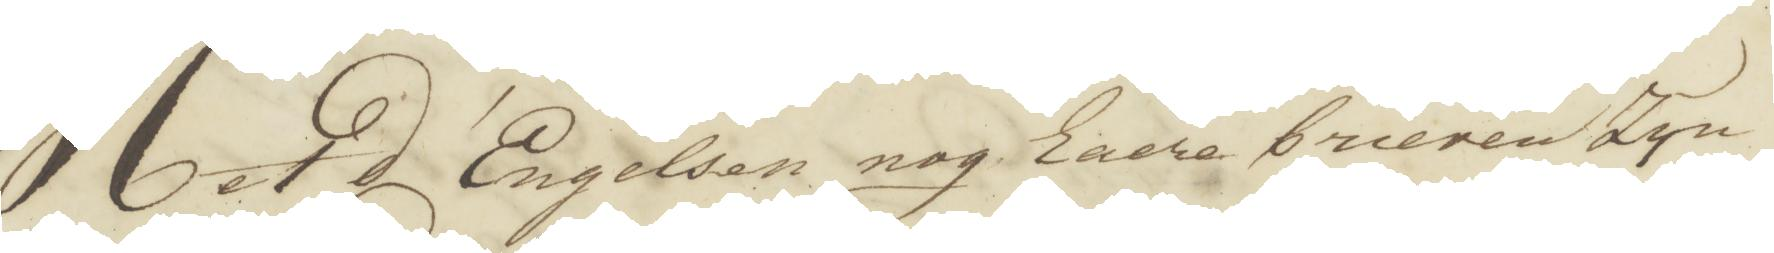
Met d'Engelsen nog haere brieven zyn
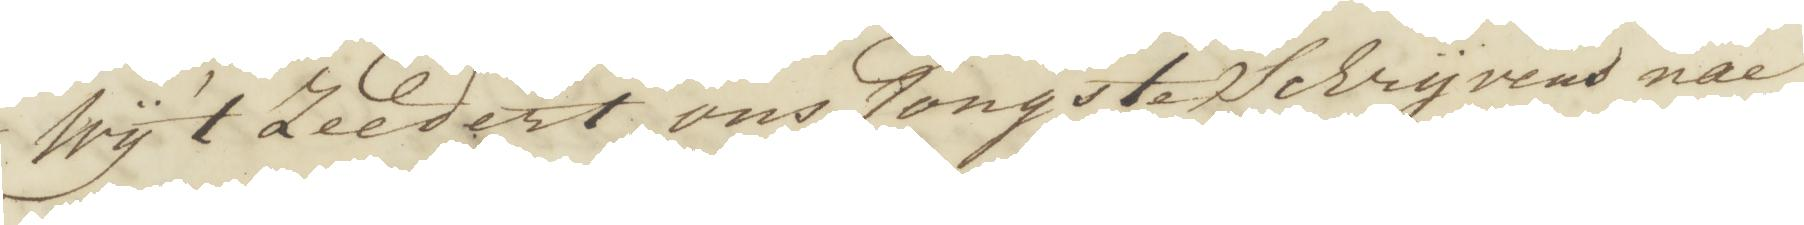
wij 't zeedert ons Jongste schrijvens nae
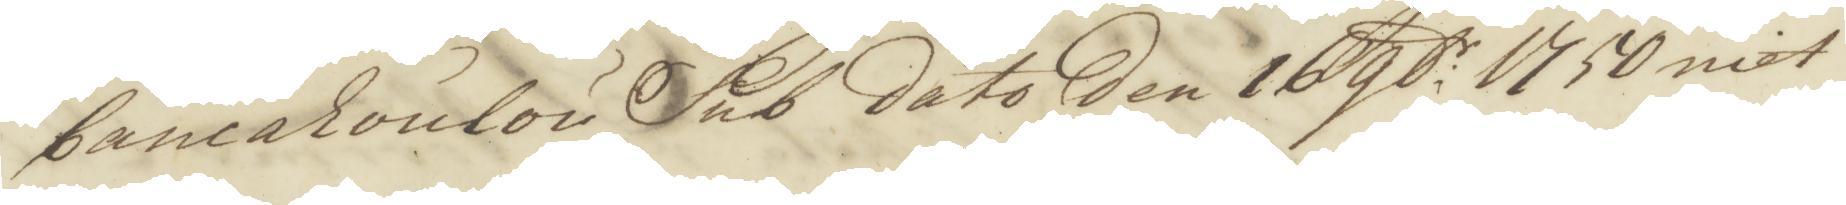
bancahoulou sub dato den 16 9b:r 1750 niet
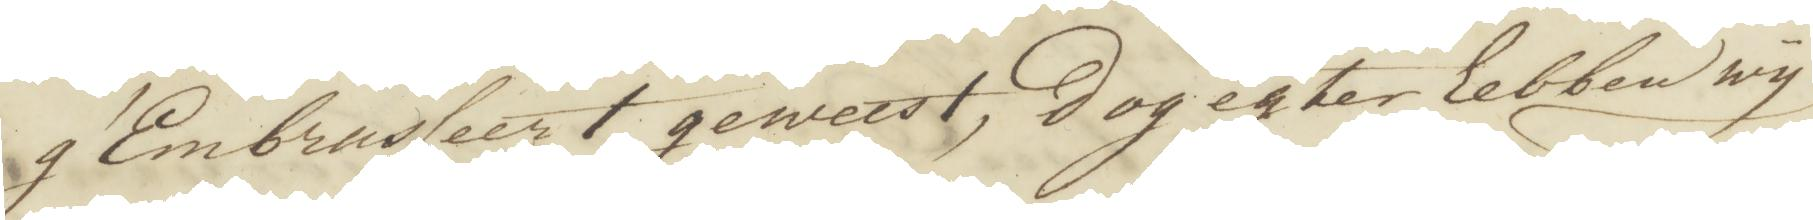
g’Embrasseert geweest, dog egter hebben wij
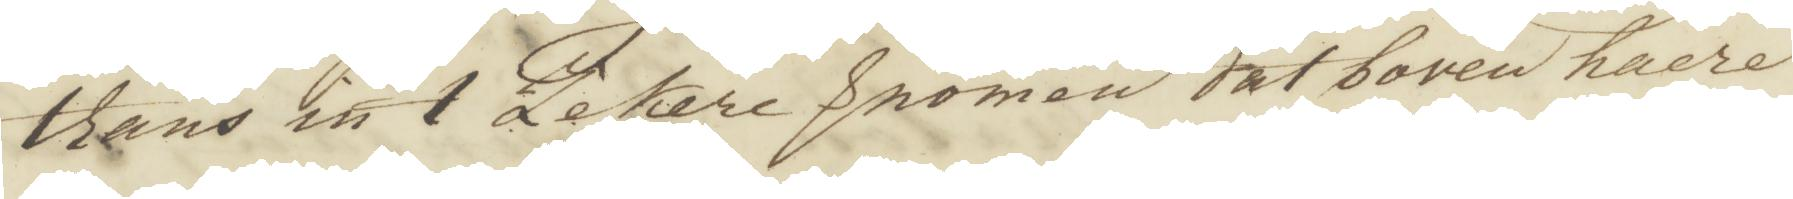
thans in ’t zekere vernomen dat boven haere
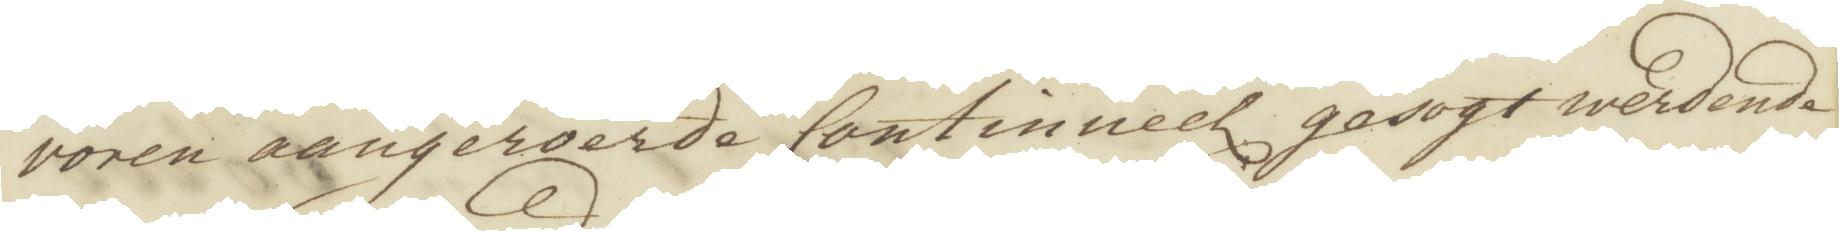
voren aangeroerde Continueel gesogt werdende
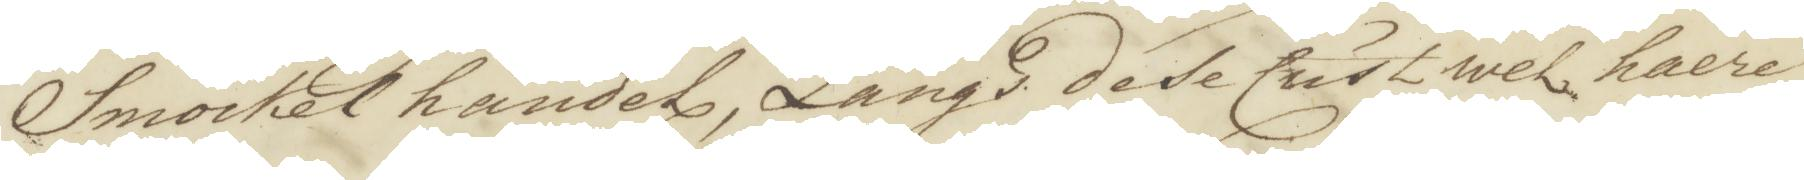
smockel handel, Langs dese Cust wel haere
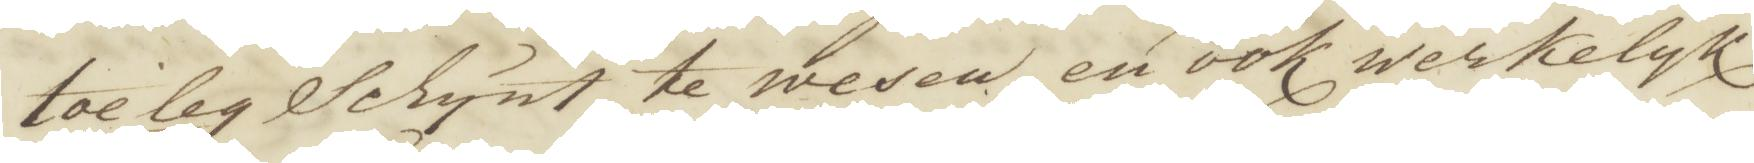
toe leg schijnt te wesen, en ook werkelijk
